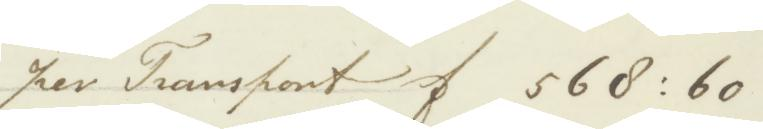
per Transport ƒ 568: 60
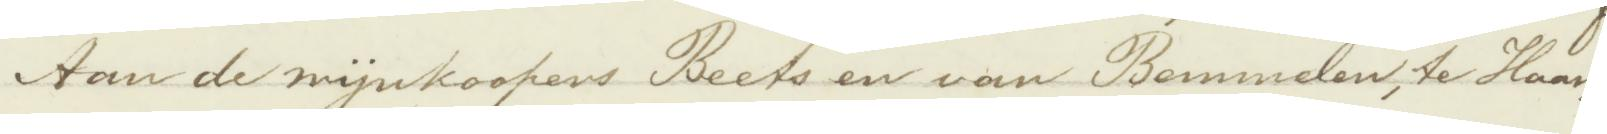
Aan de mijnkoopers Beets en van Bemmelen, te Haar„
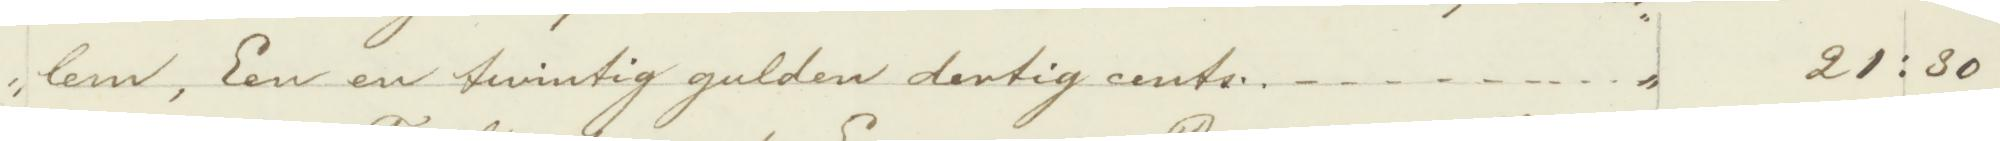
„lem, Een en twintig gulden dertig cents. . - - - - - - - - - „ 21: 30
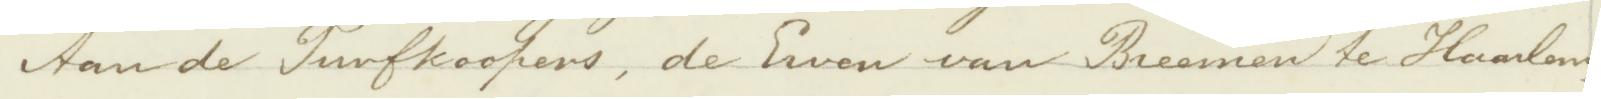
Aan de Turfkoopers, de Erven van Breemen te Haarlem,
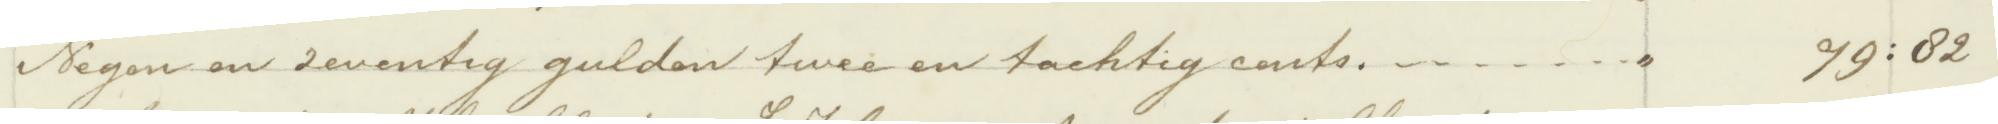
Negen en zeventig gulden twee en tachtig cents. - - - - - - - „ 79: 82
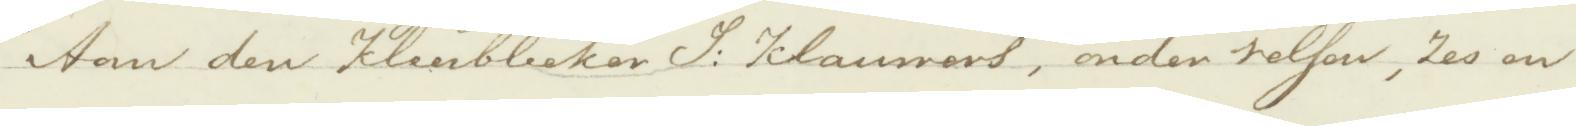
Aan den Kleerbleeker I: Klauwers, onder velsen, zes en
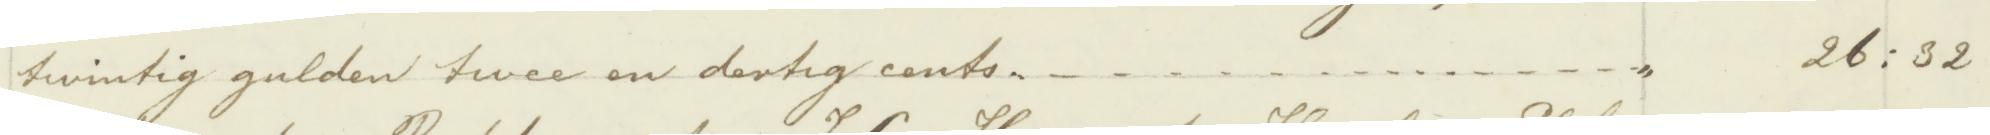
twintig gulden twee en dertig cents. . - - - - - - - - - - - - - - - „ 26: 32
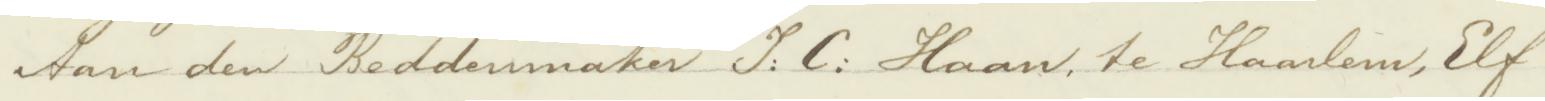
Aan den Beddenmaker I: C: Haan, te Haarlem, Elf
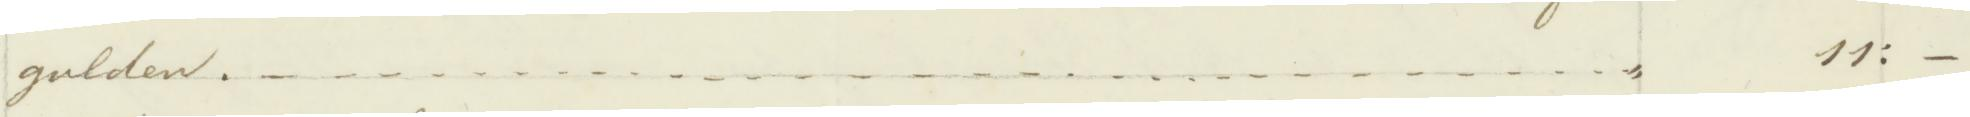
gulden. - - - - - - - - - - - - - - - - - - - - - - - - - - - - - - „ 11:
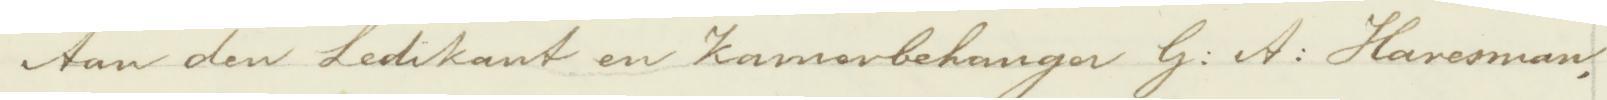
Aan den Ledikant en kamerbehanger G: A: Haresman,
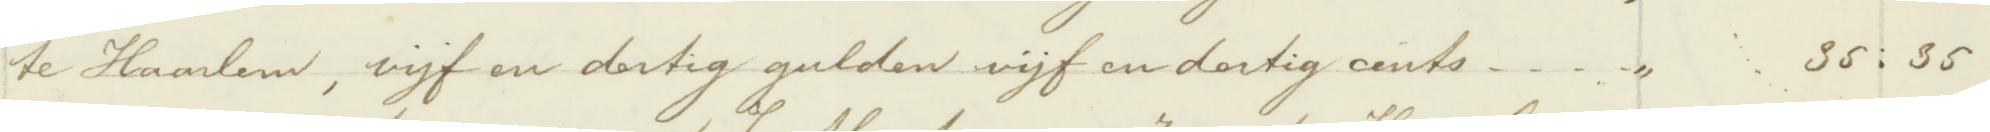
te Haarlem, vijf en dertig gulden vijf en dertig cents - - - - „ 35: 35
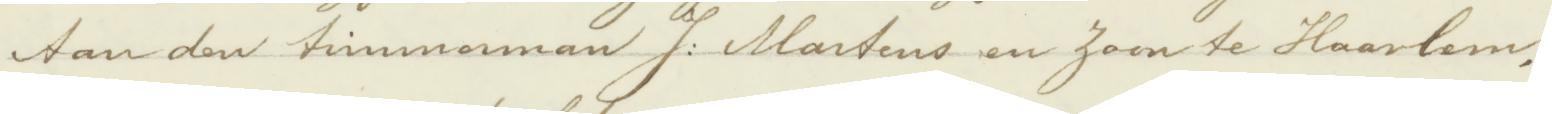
Aan den timmerman J: Martens en Zoon te Haarlem,
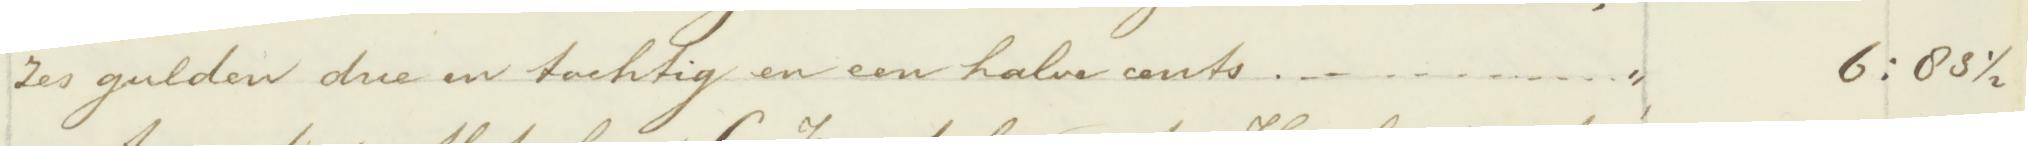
zes gulden drie en tachtig en een halve cents. - - - - - - . - - . . „ 6: 83½
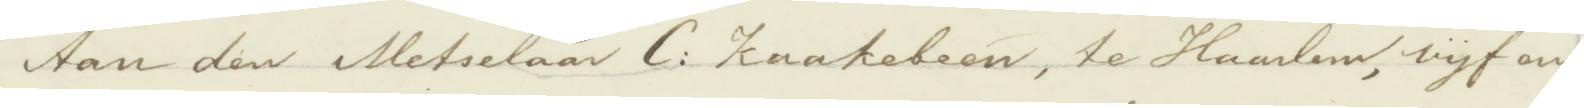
Aan den Metselaar C: Kaakebeen, te Haarlem, vijf en
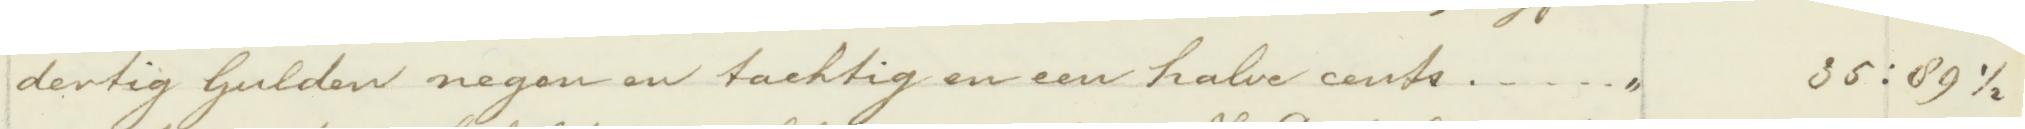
dertig Gulden negen en tachtig en een halve cents. - - - - „ 35: 89½
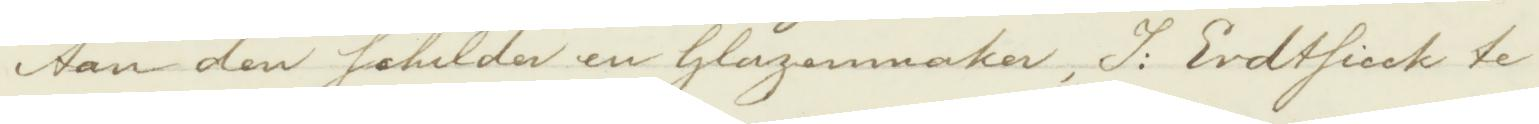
Aan den schilder en Glazenmaker, I: Erdtsieck te
